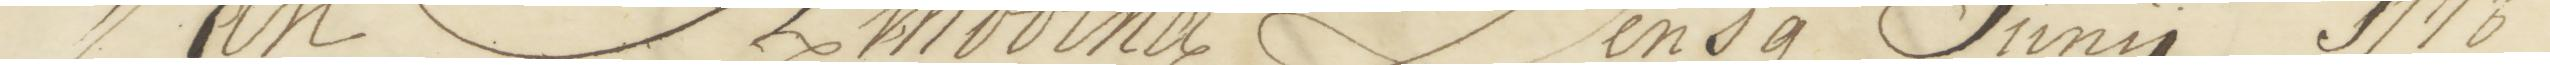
Van Amboina Den 19 Iunij 1748
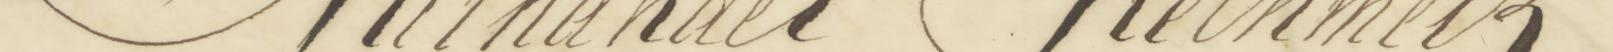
Nathanael Steinmetz
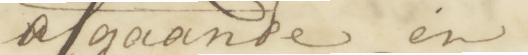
afgaande en
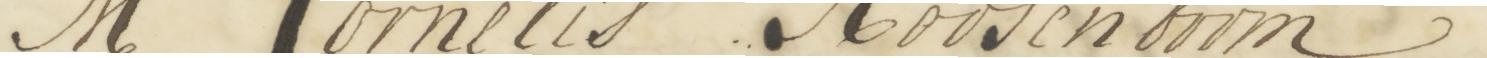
M-r Cornelis Roosenboom
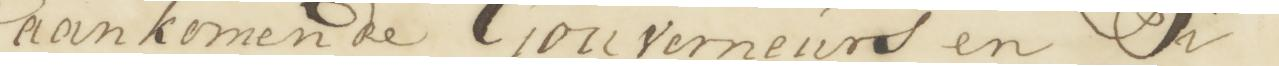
aan komende Gouverneurs en Di
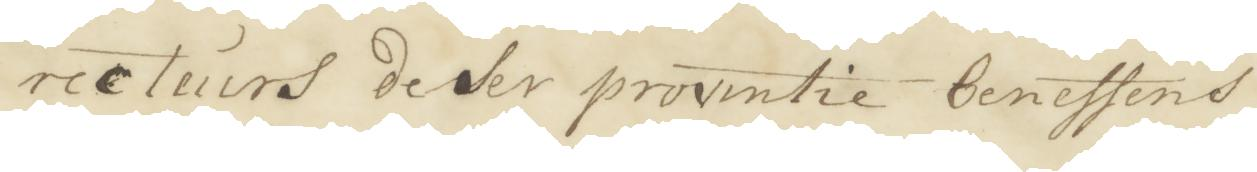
recteurs deser provintie beneffens
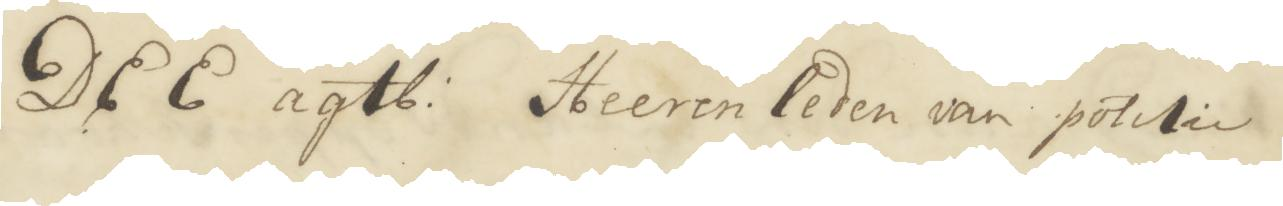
DE E agtb: Heeren leden van politie
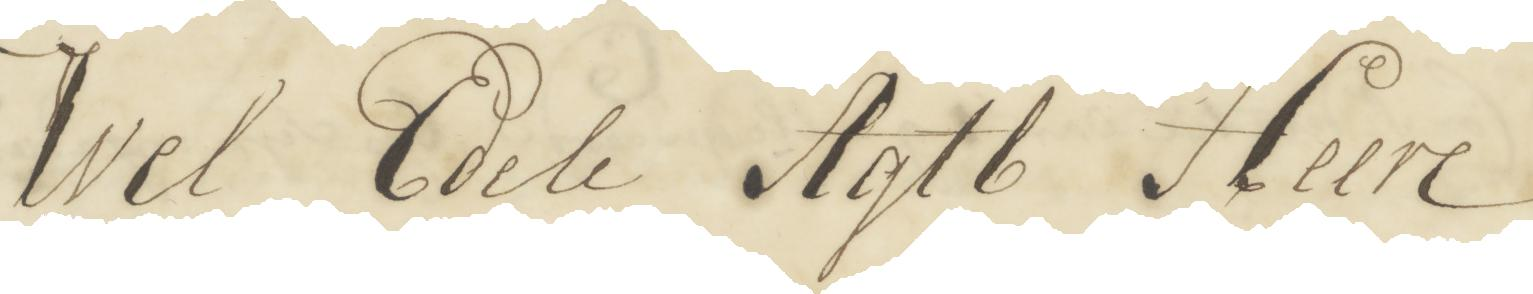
Wel Edele Agtb Heere
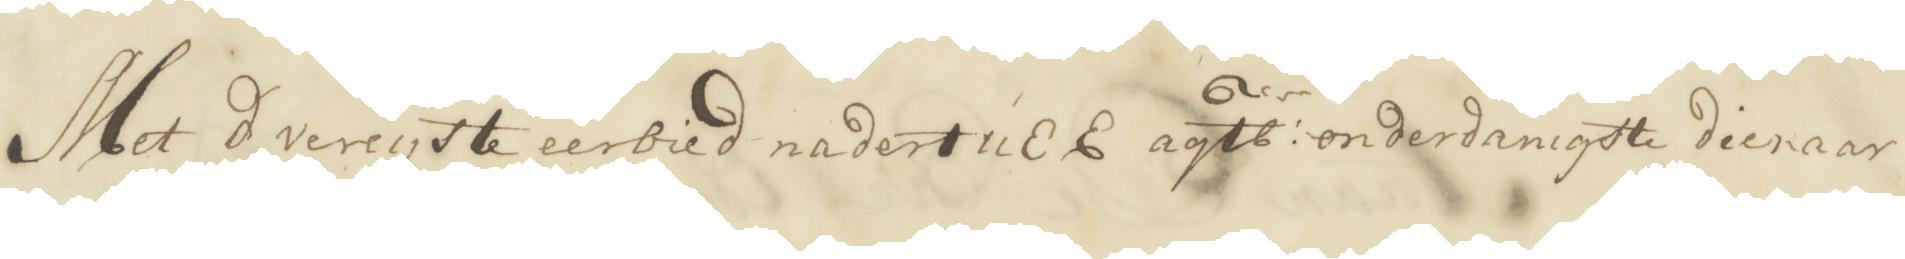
Met d’ vereyste eerbied nadert uE E agtb: onderdanigste dienaar
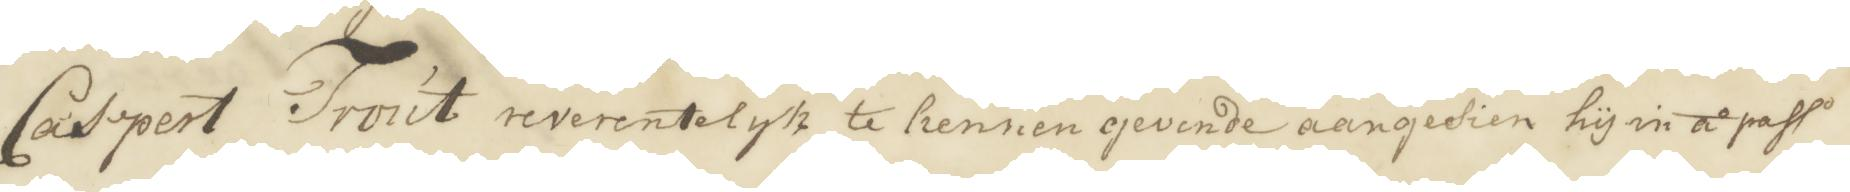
Caspert Trout reverentelyk te kennen gevende aangesien hij in a:o passo
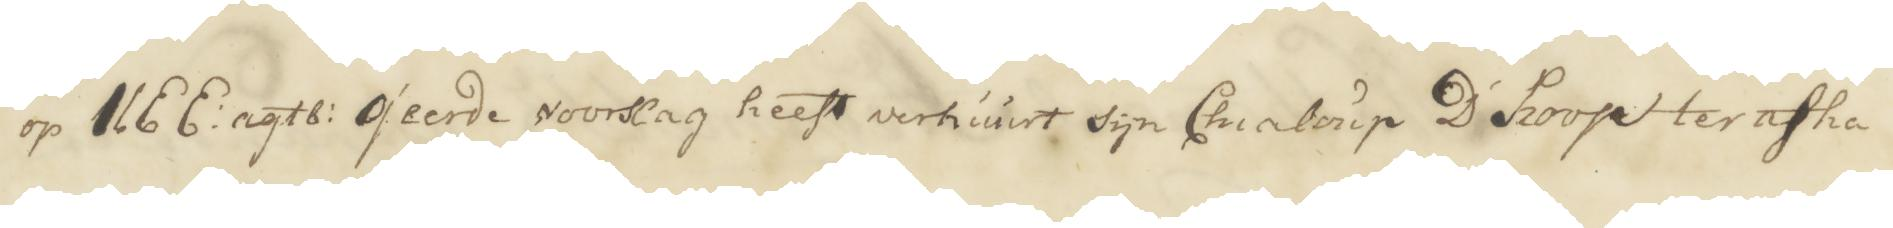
op UE E: agtb: g’eerde voorslag heeft verhuurt sijn Chialoup D' hoop ter afha
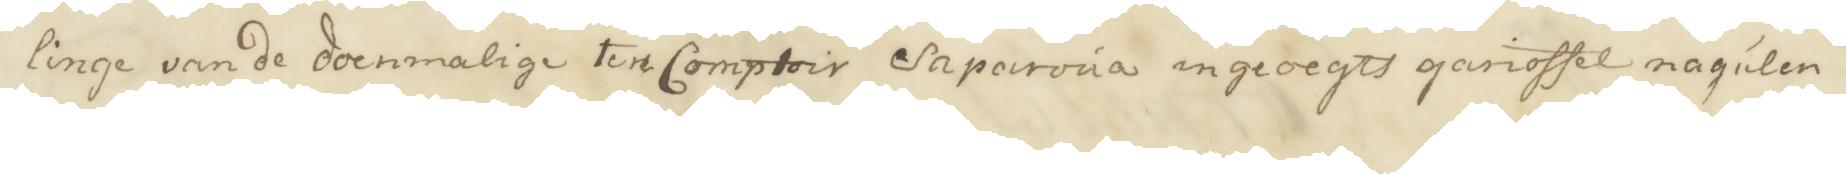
linge van de doenmalige ten Comptoir Saparoua in geoegts garioffel nagulen
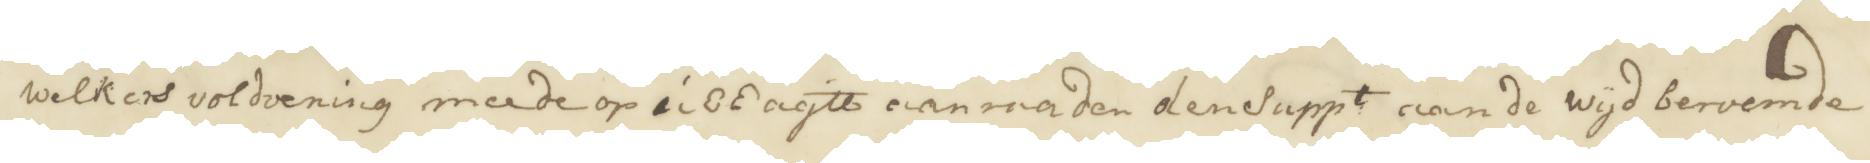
welkers voldoening meede op uE E agtb aanraaden den supp:t aan de wijd beroemde
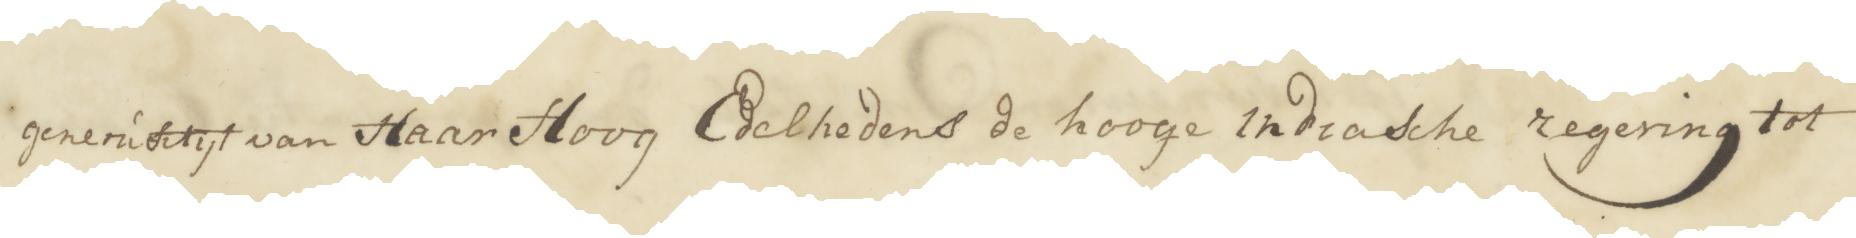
generusitijt van Haar Hoog Edelhedens de hooge indiasche regering tot
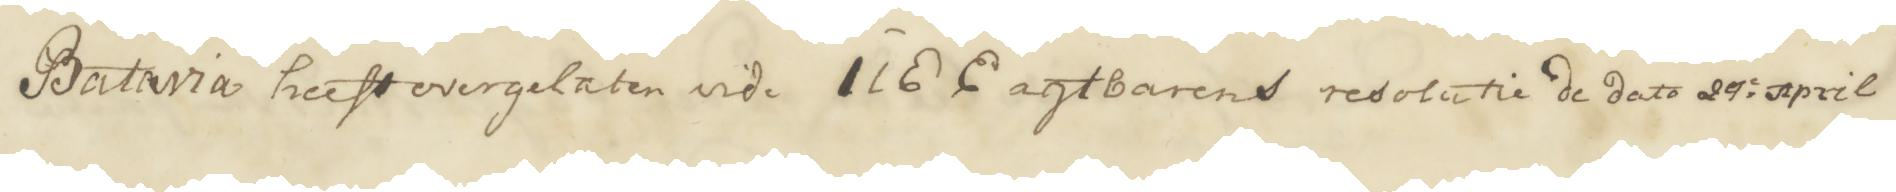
Batavia heeft overgelaten vide UE E agtbarens resolutie de dato 24: April
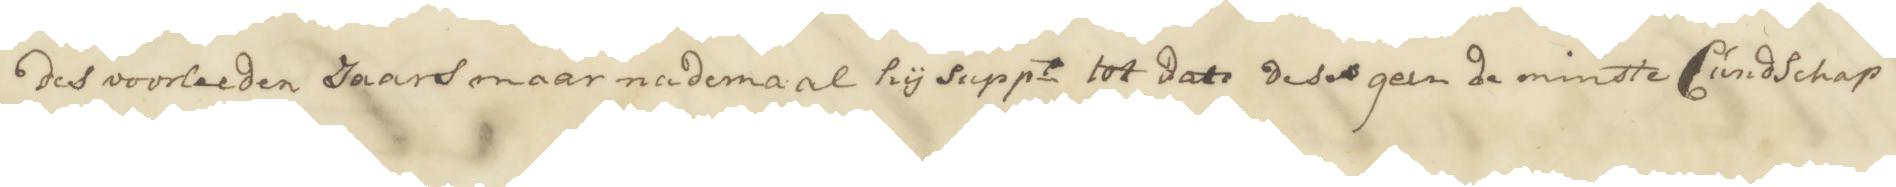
des voorleeden Jaars maar nademaal hij supp=t tot dato deser geen de minste Cundschap
